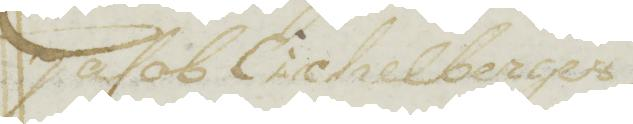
Jacob Eichelberger
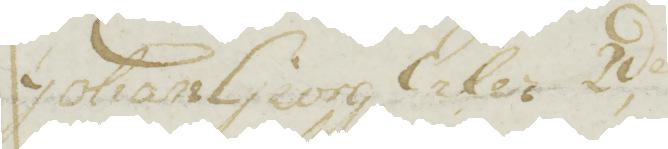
Johan Georg Erler 2,de
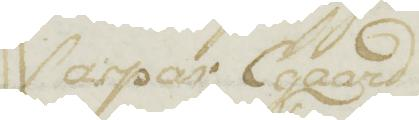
Caspar Egaard
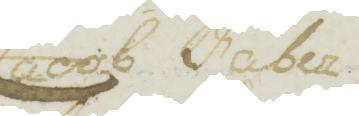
Jacob Faber
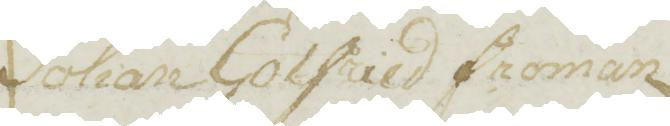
Johan Gotfried froman
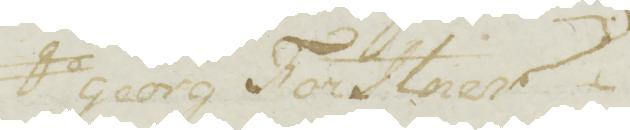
d=o georg Forstner
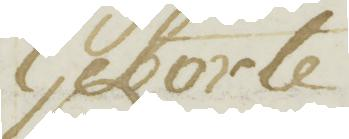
Geborte
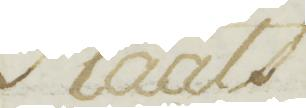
Plaats
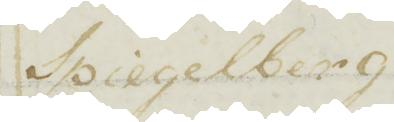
spiegelberg
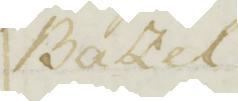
Bazel
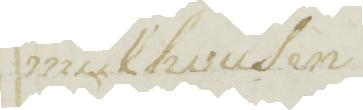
mulhousen
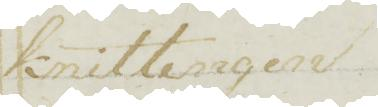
knittengen
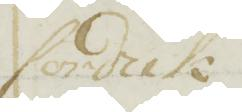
Cordrek
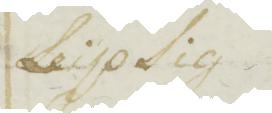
Leipsig
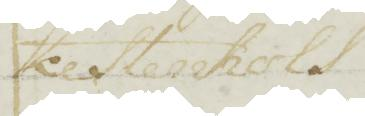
kestenhols
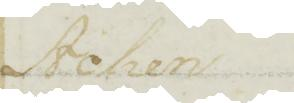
Achen
